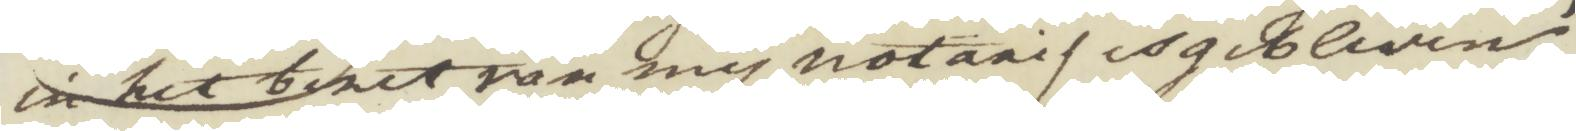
in het bezit van my notaris is gebleven,
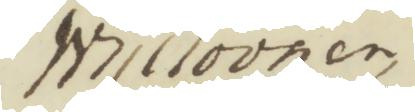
J Wydoogen,
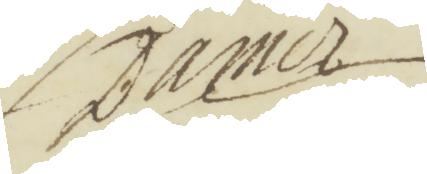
Damer.
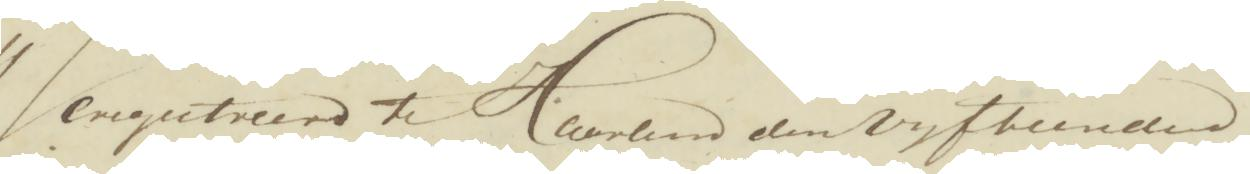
Geregistreerd te Haarlem den vijftienden
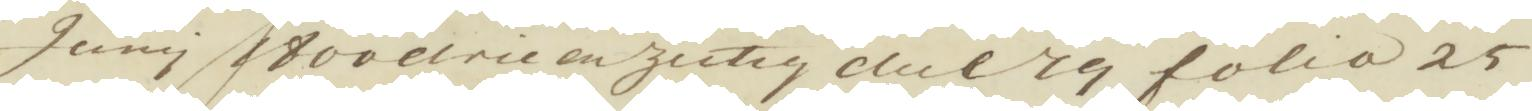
Junij 1800drie en zestig deel 79 folio 25
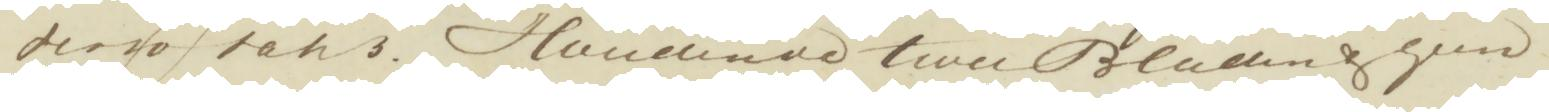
verso vak 3. Houdende twee Bladen & geen
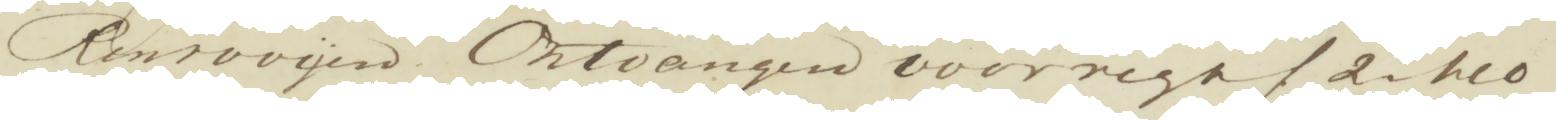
Renvooijen Ontvangen voor regt ƒ2.40
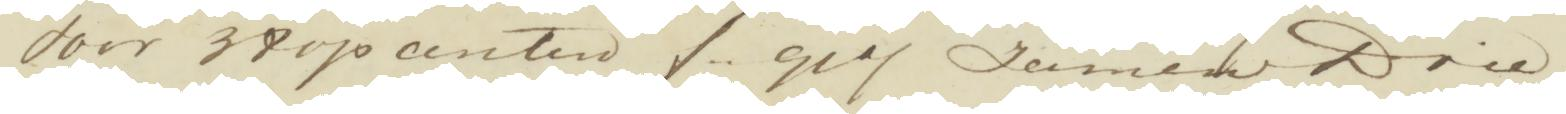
door 37 opcenten ƒ.. 91½ zamen Drie
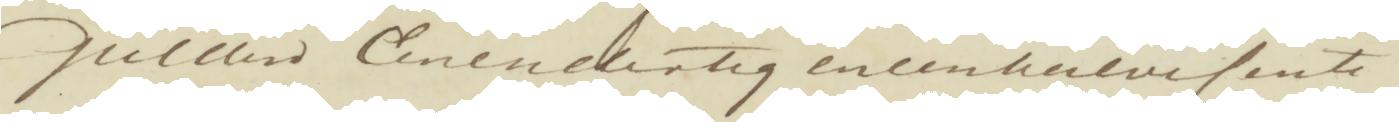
Gulden Eenendertig en een halve Cent
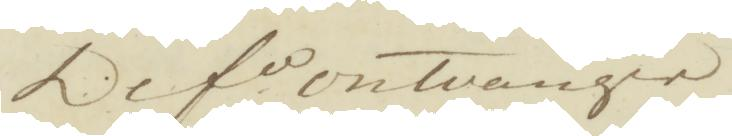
De f.o ontvangen
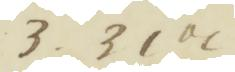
3. 31½
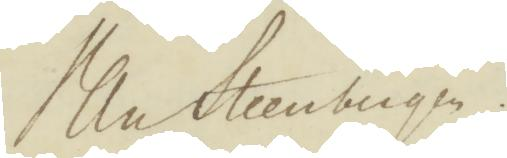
Van Steenbergen
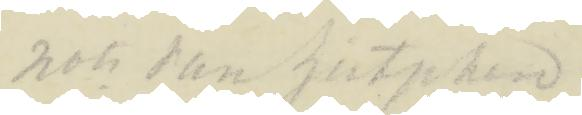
Not van Zutphen
